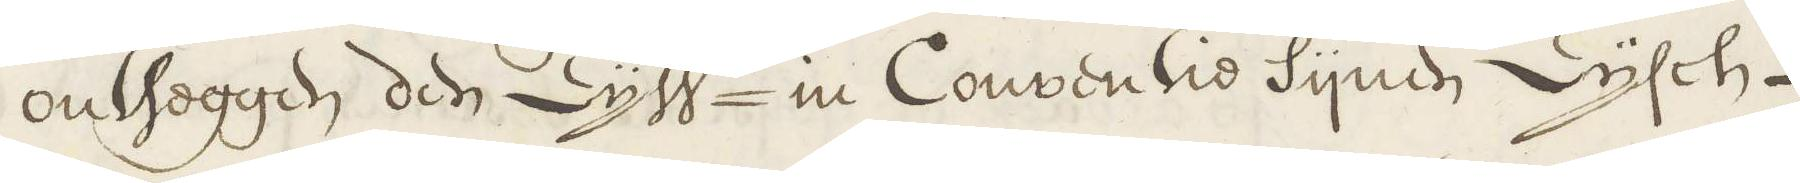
ontseggen den Eijss=r in Conventie sijnen Eijsch-
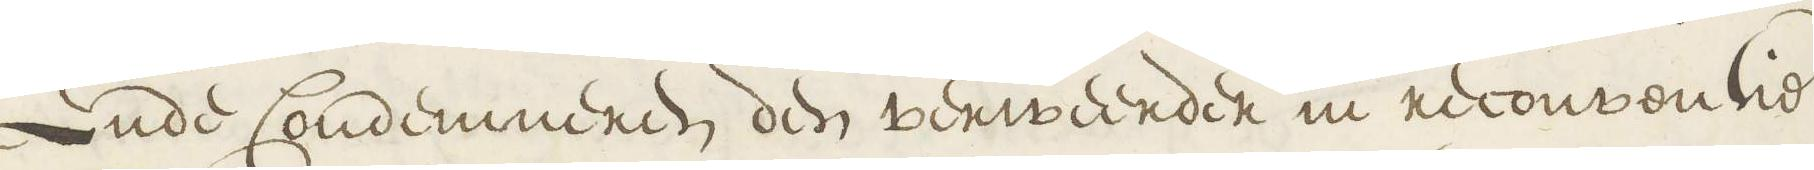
Ende Condemneren den verweerder in reconventie
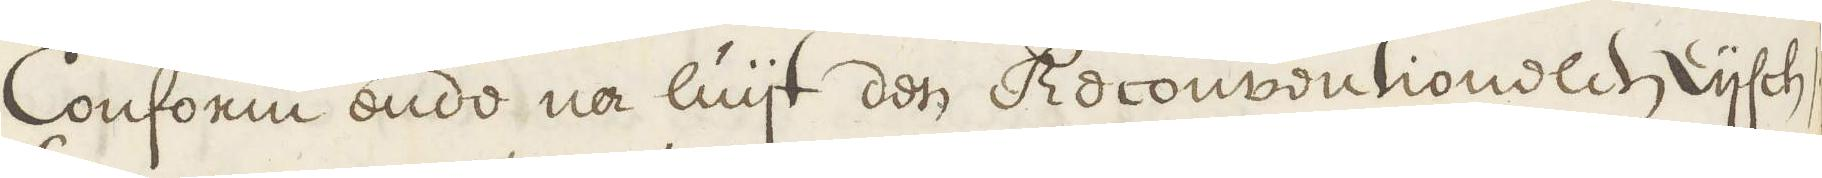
Conform ende na luijt den Reconventionelen Eijsch
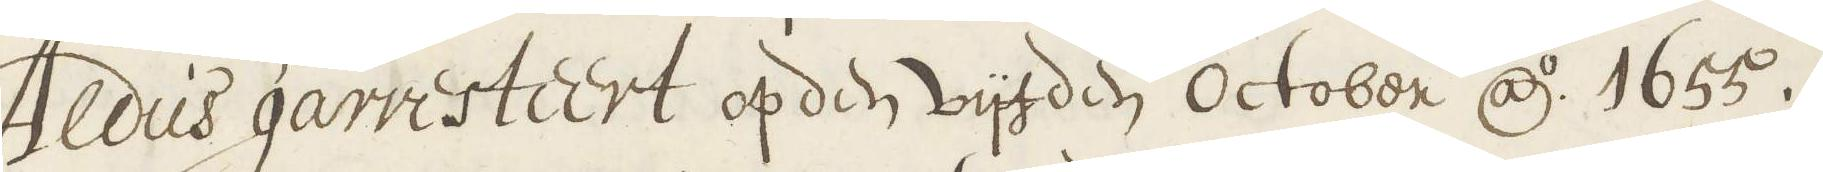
Aldus g'arresteert op den vijfden October a.o 1655.
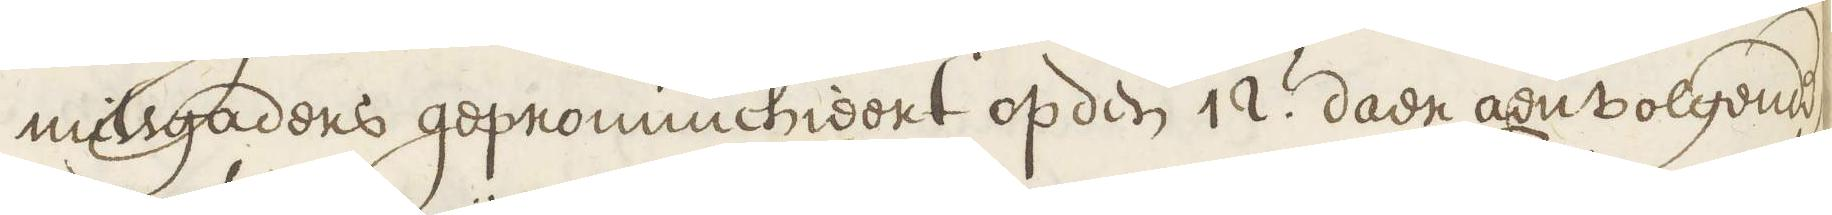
mitsgaders gepronunchieert op den 12.' daer aen volgende
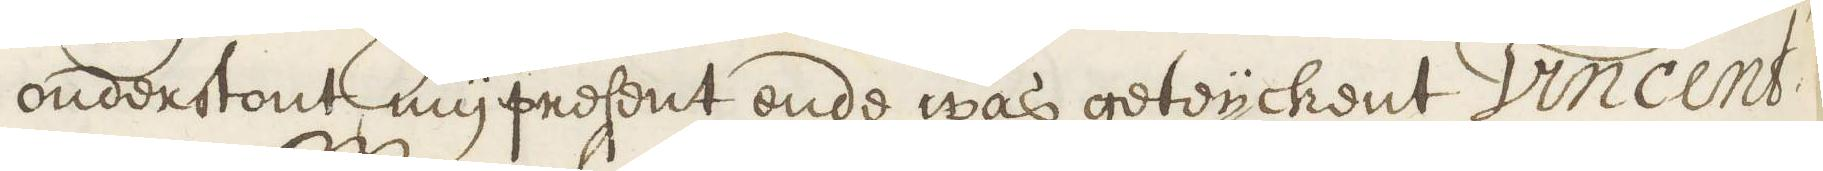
onderstont mij present ende was geteijckent Vincent
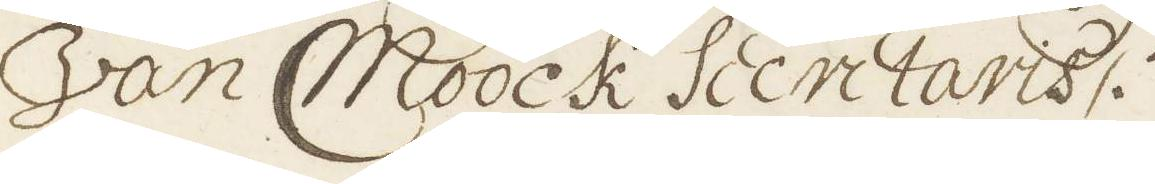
Van Moock Secretaris /.
